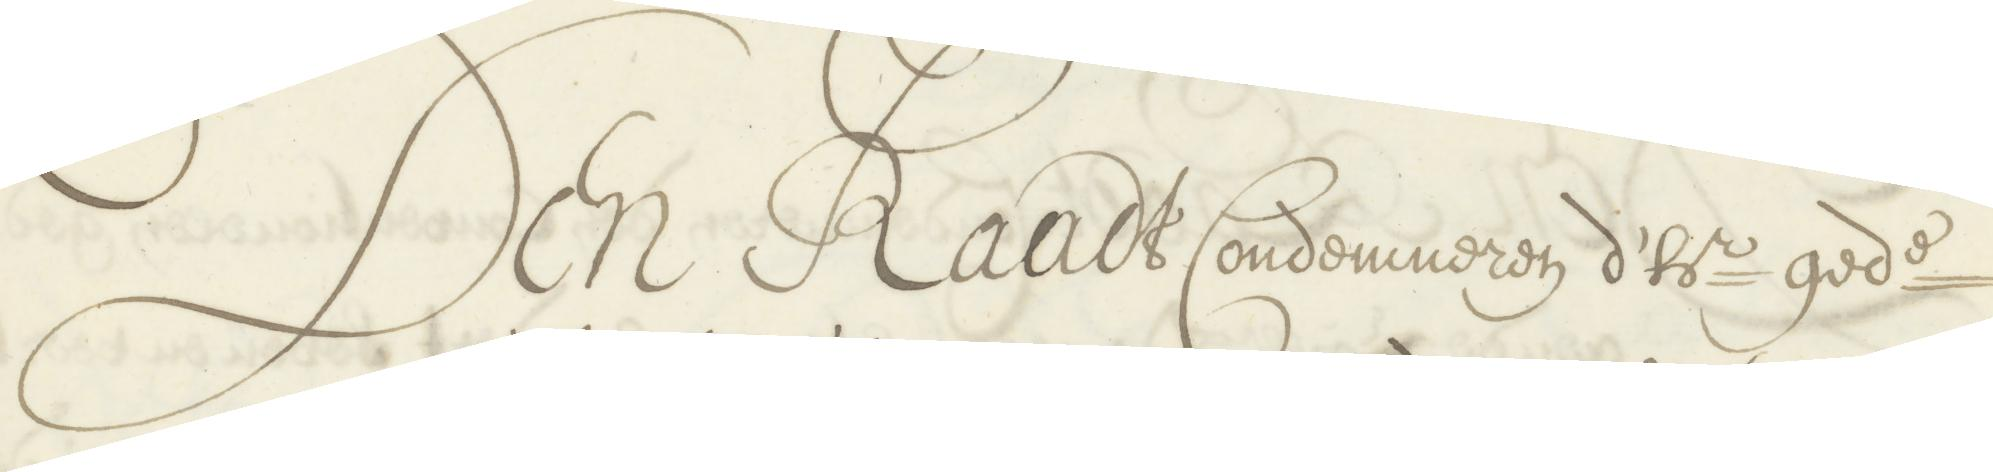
Den Raadt Condemneren d’h=r ged=e
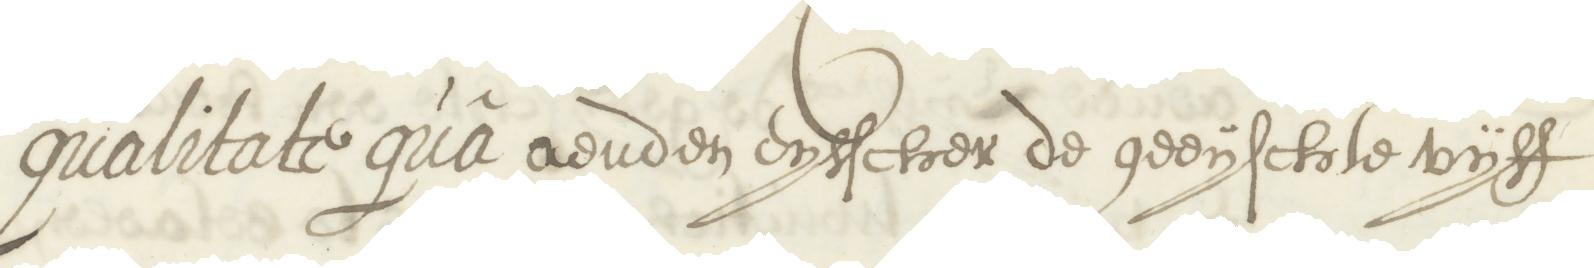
quatitate qua aenden eijsscher de geeijschte vijff
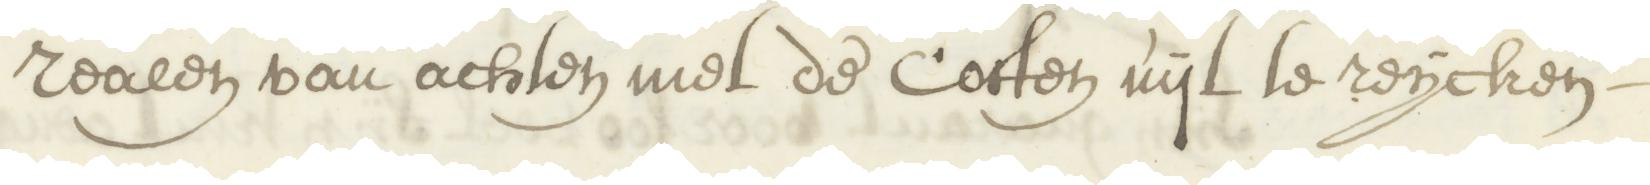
realen van achten met de costen uijt te reijcken —
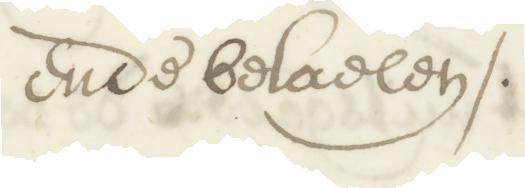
ende betaelen/.
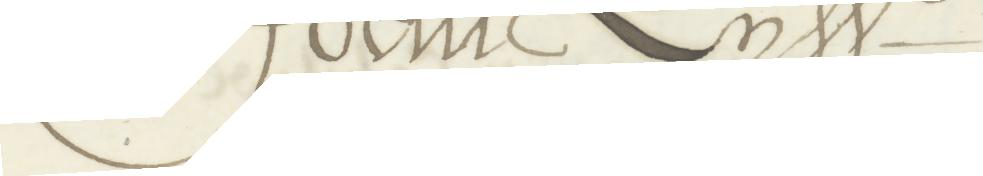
Jdem Eijss=r
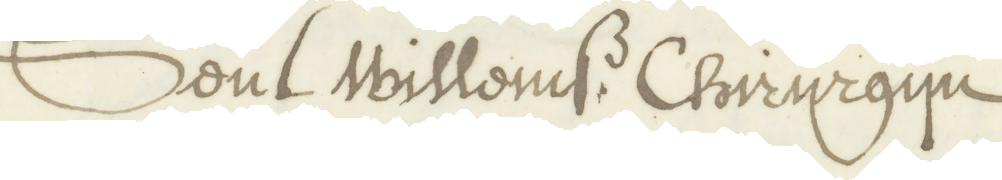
Sent Willems.z Chirurgijn
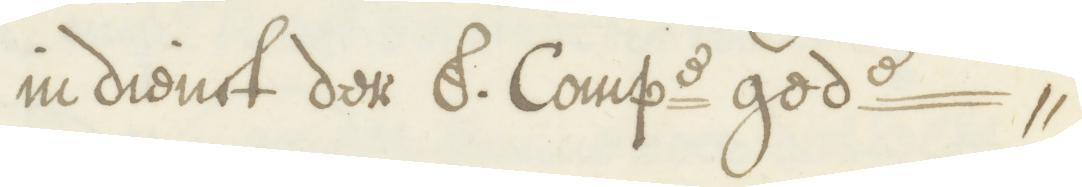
in dienst der E. Comp=e ged=e „
